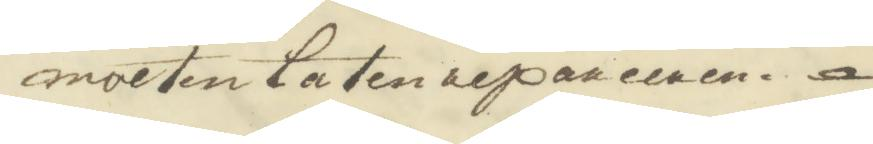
moeten laten repareeren.
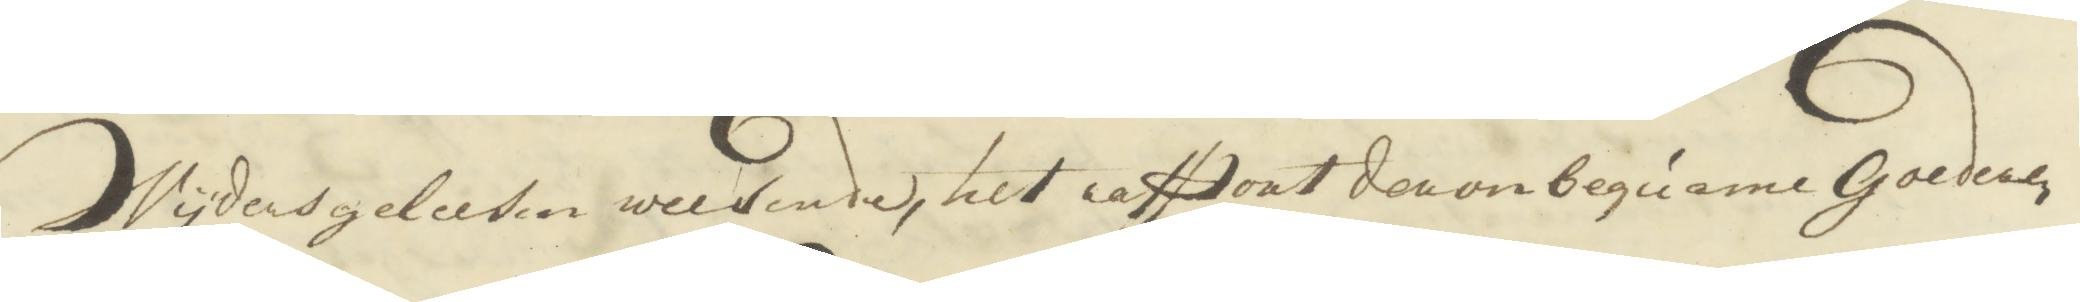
Wijders geleesen weesende, het rapport der onbequame goederen
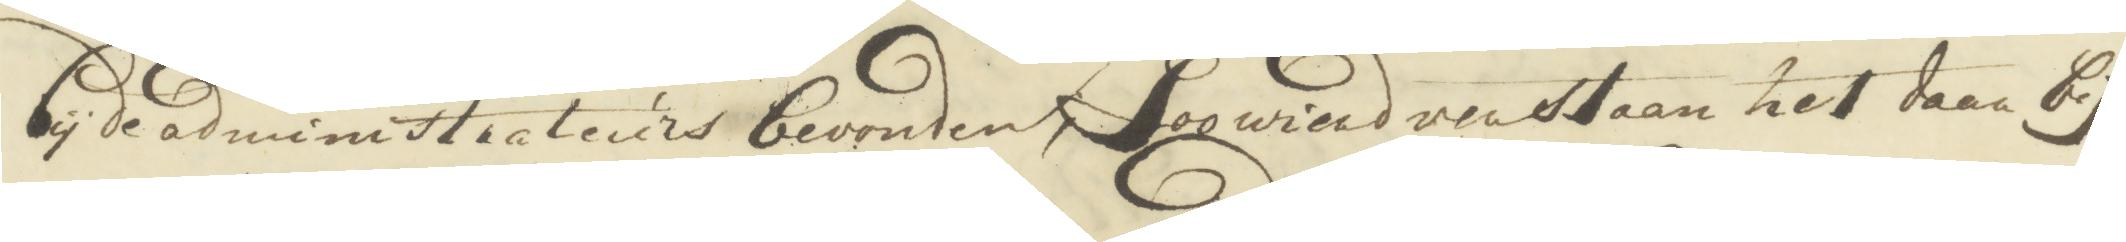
bij de administrateurs bevonden, soo wierd verstaan het daar bij
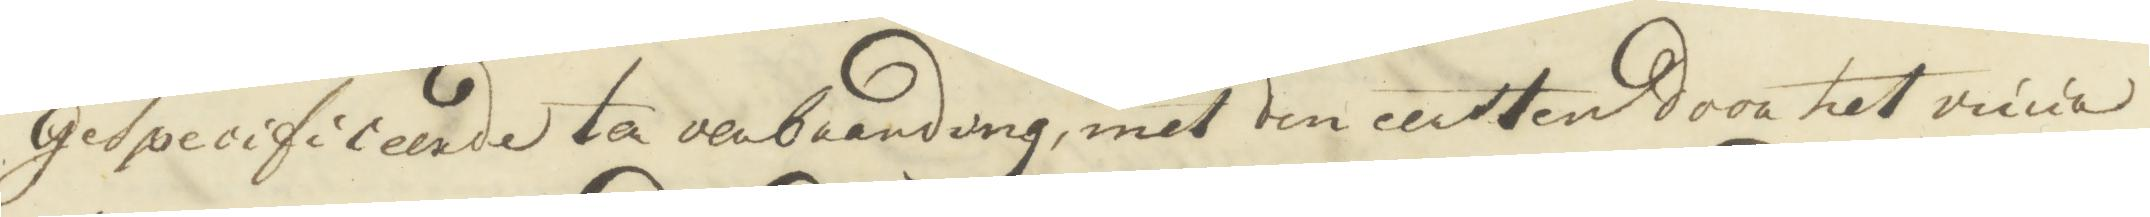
gespecificeerde ten verbranding, met den eersten door het vuur
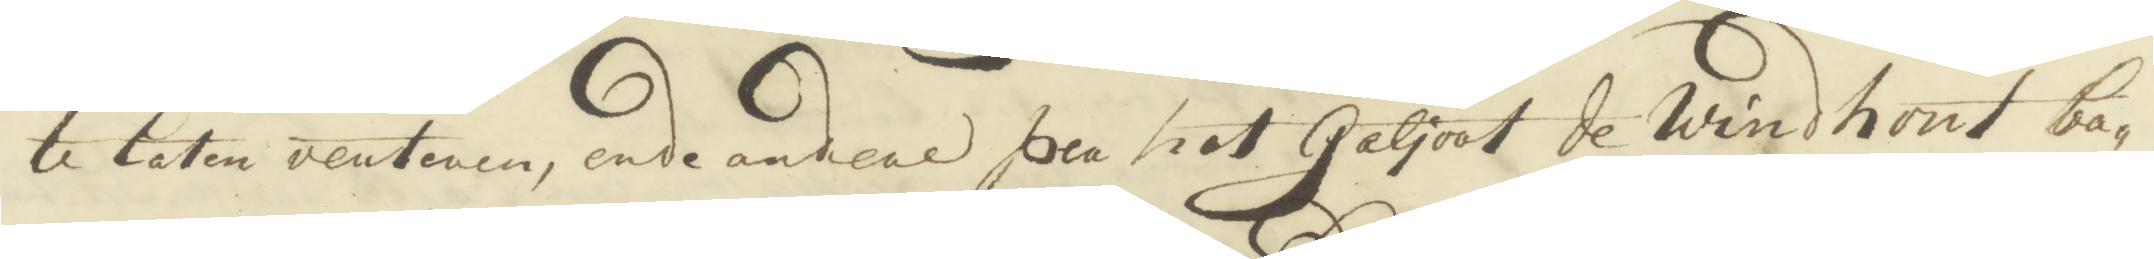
te laten verteren, ende andere per het galjoot de Windhout ba„
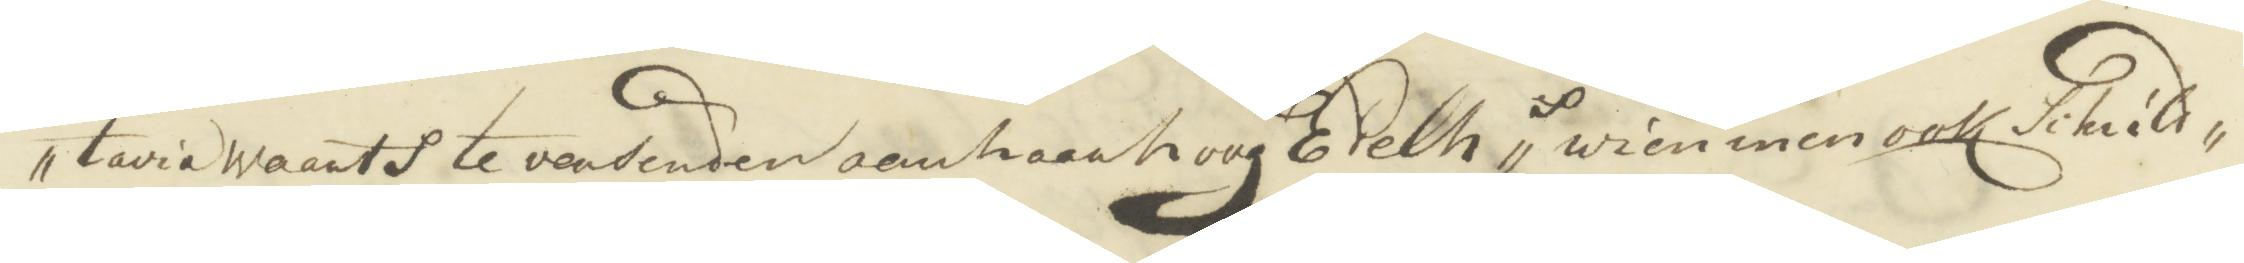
„ tavia waarts te versenden aan haar hoog Edelh„' wien men ook schuld„
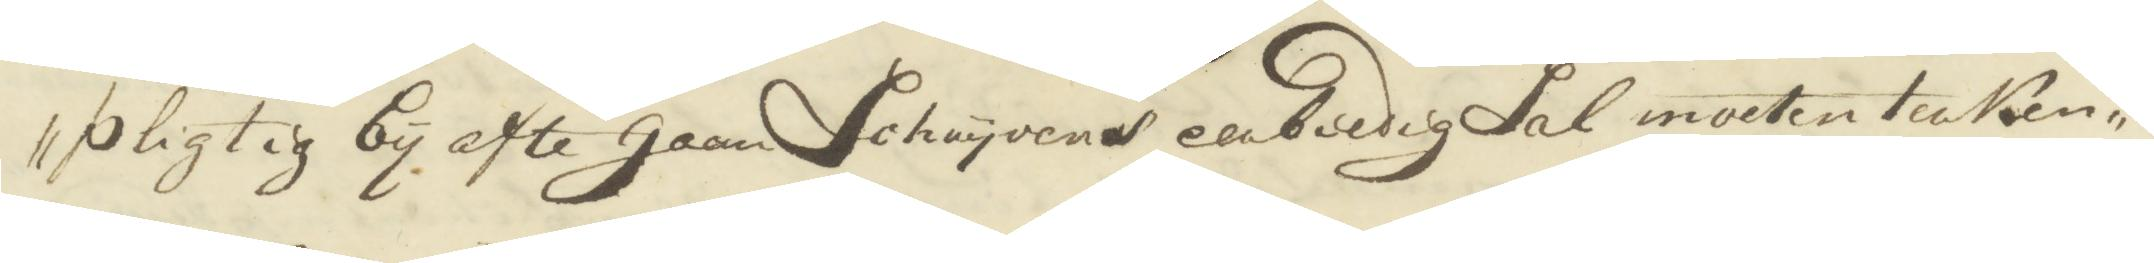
„pligtig bij afte gaan schrijvens eerbiedig sal moeten ter Ken„
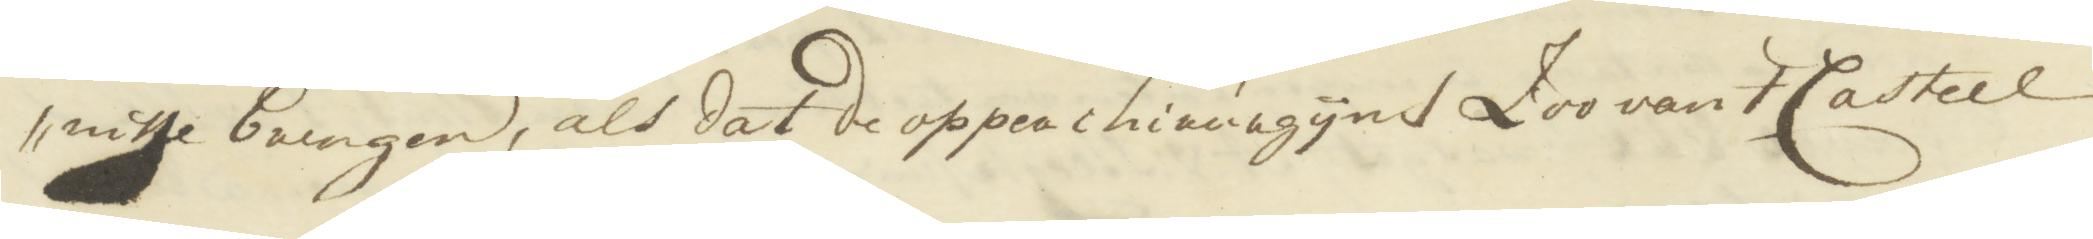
„nisse brengen, als dat de opperchirurgijns zoo van ’t Casteel
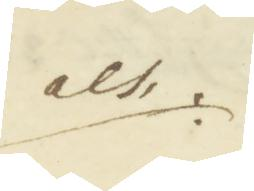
als, :
